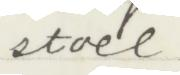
stoel
